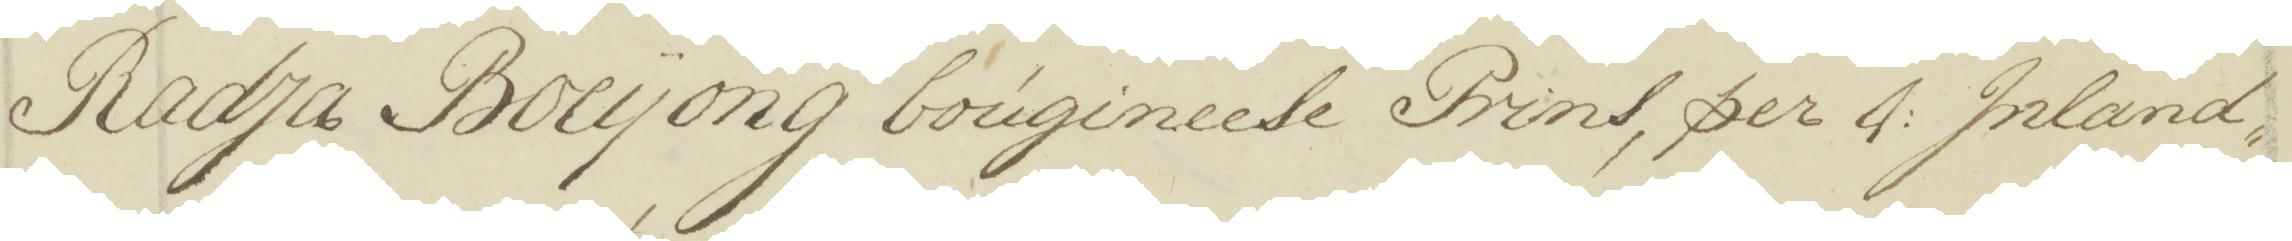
Radja Boeijong bougineese Prins, per 4: Jnland„
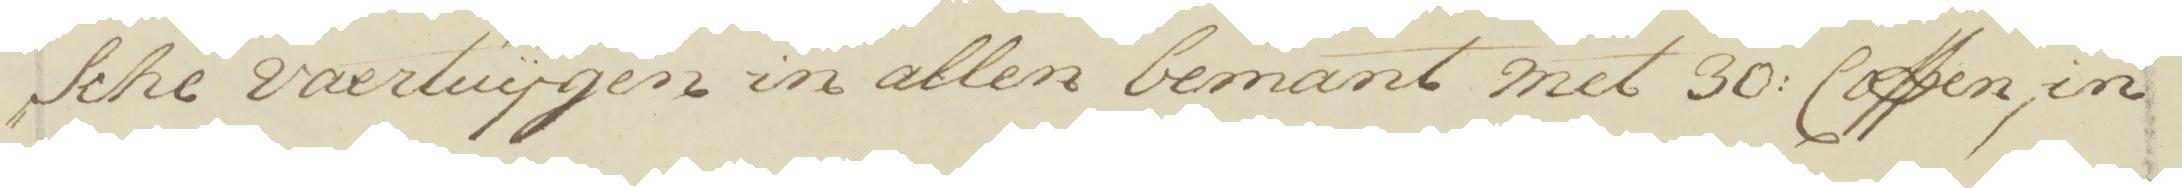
„sche vaertuijgen in allen bemant met 30: doppen, is
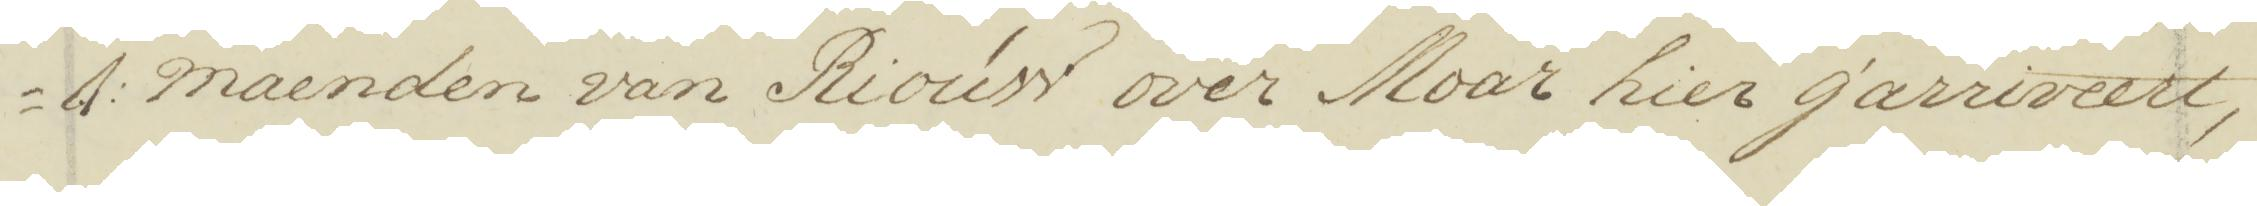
„4: maenden van Riouw over Moar hier g'arriveert,
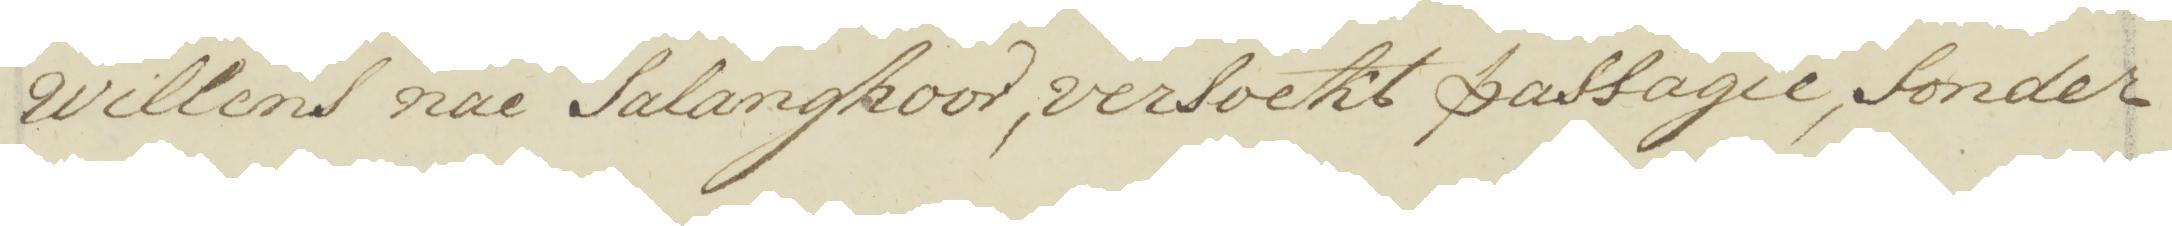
willens nae Salanghoor, versoekt passagie, sonder
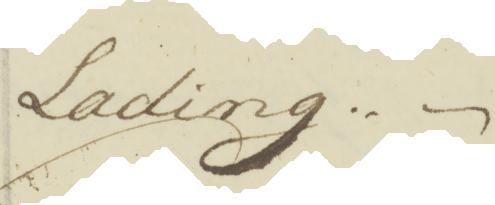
Lading.
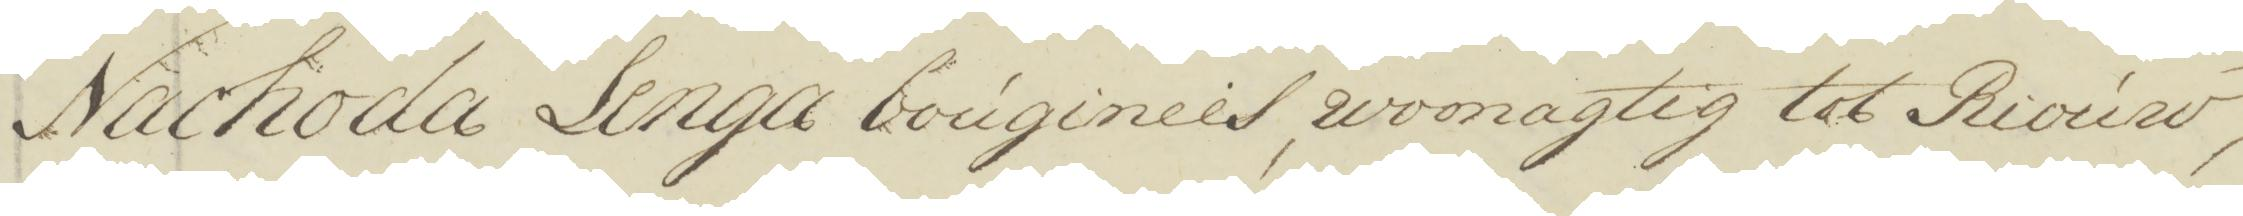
Nachoda Lenga bouginees, woonagtig tot Riouw,
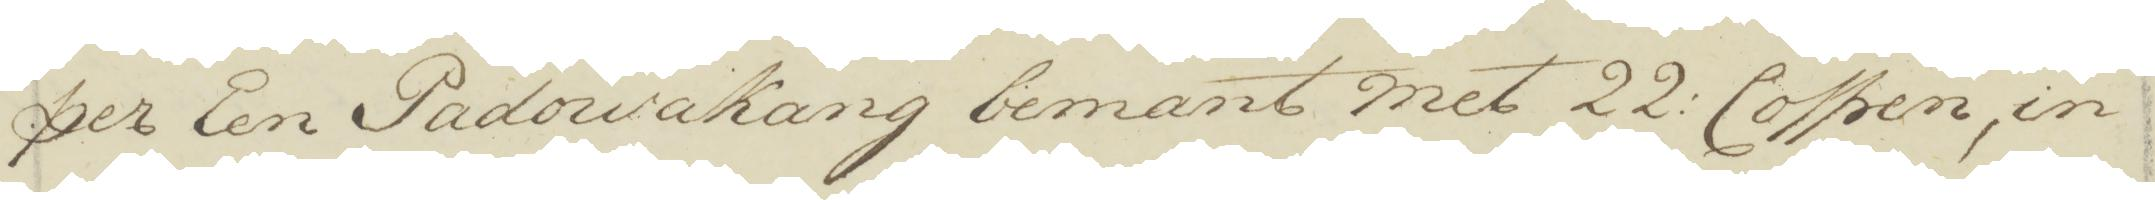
per Een Padowakang bemant met 22: coppen, in
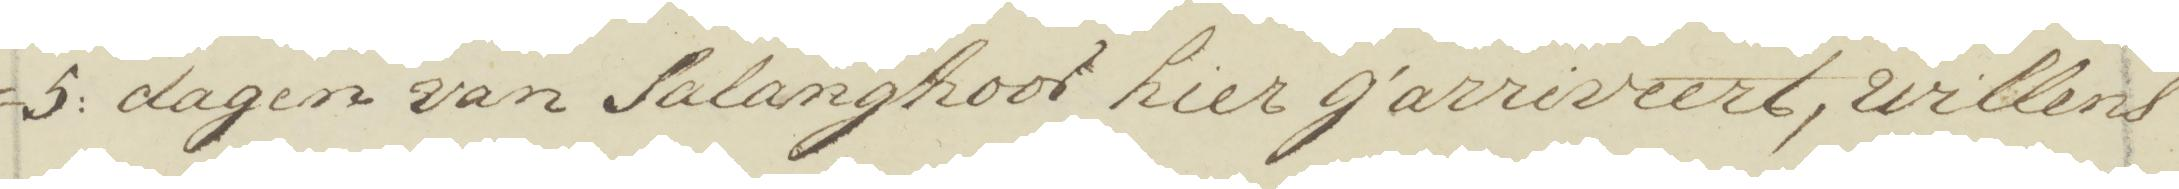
=5: dagen van Salanghoor hier g’arriveert, willens
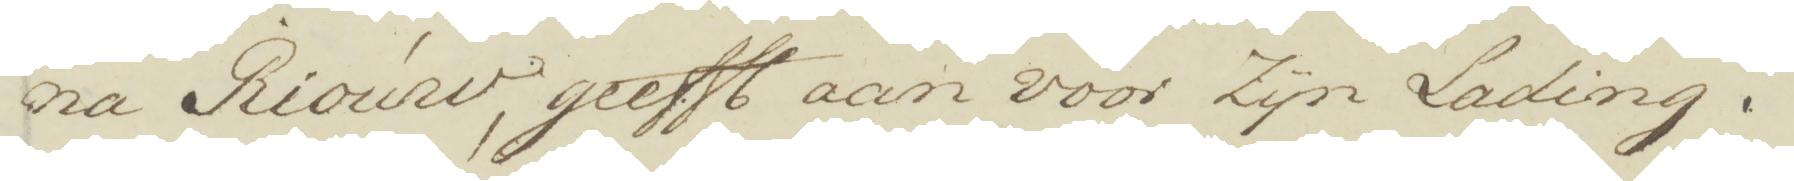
na Riouw geefft aan voor zijn lading.
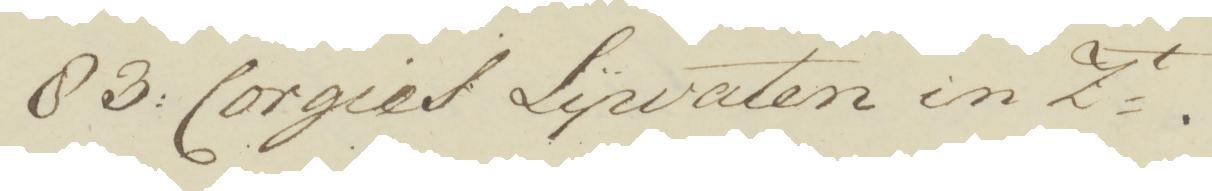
83: Corgies Lijwaten in z=t.
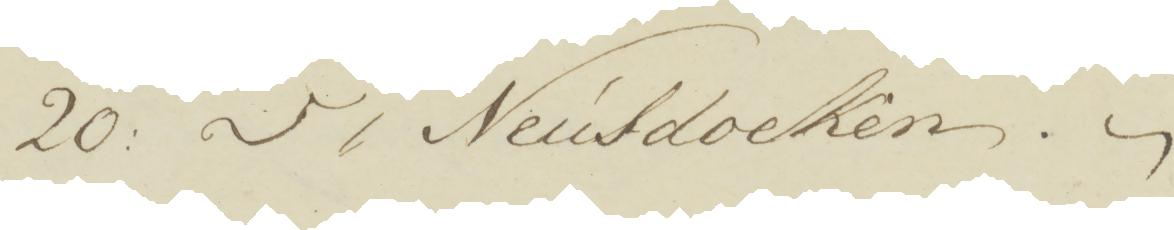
20: d„o Neusdoeken.
